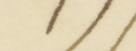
19/
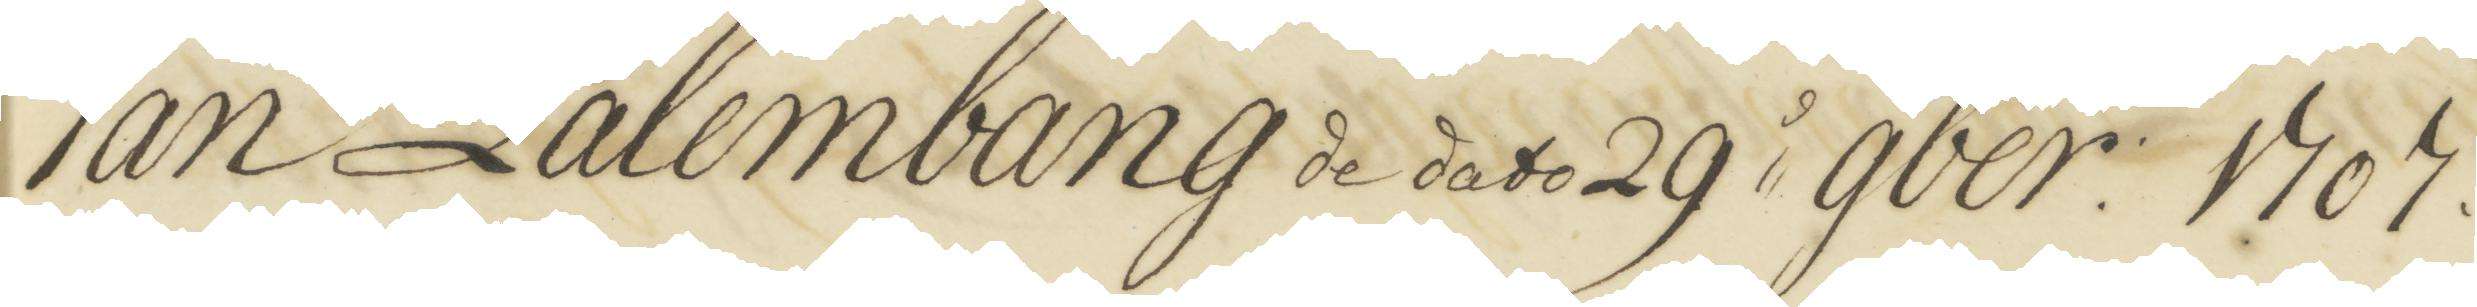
Van Palembang de dato 29„e 9ber: 1707.
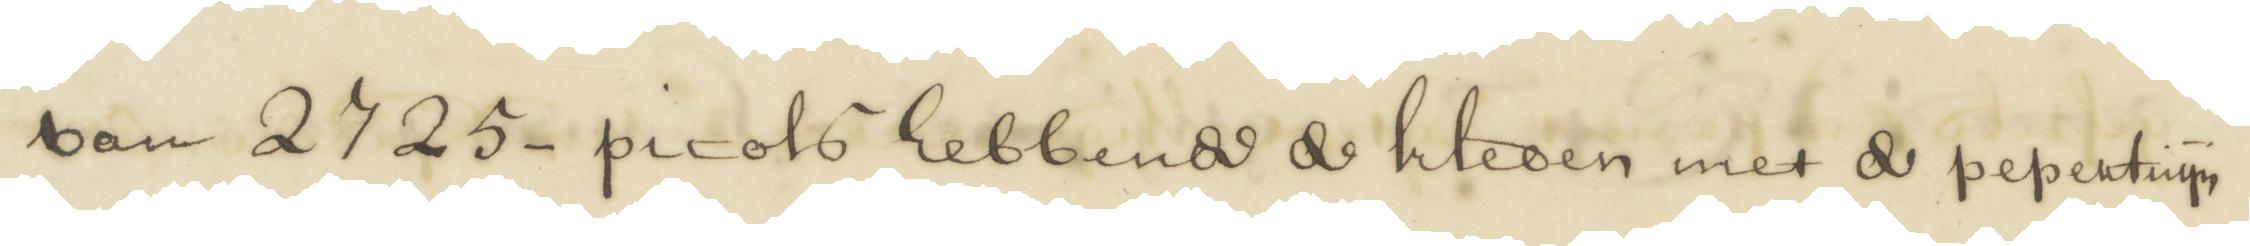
van 2725 - picols hebbende de kleden met de pepertuijn
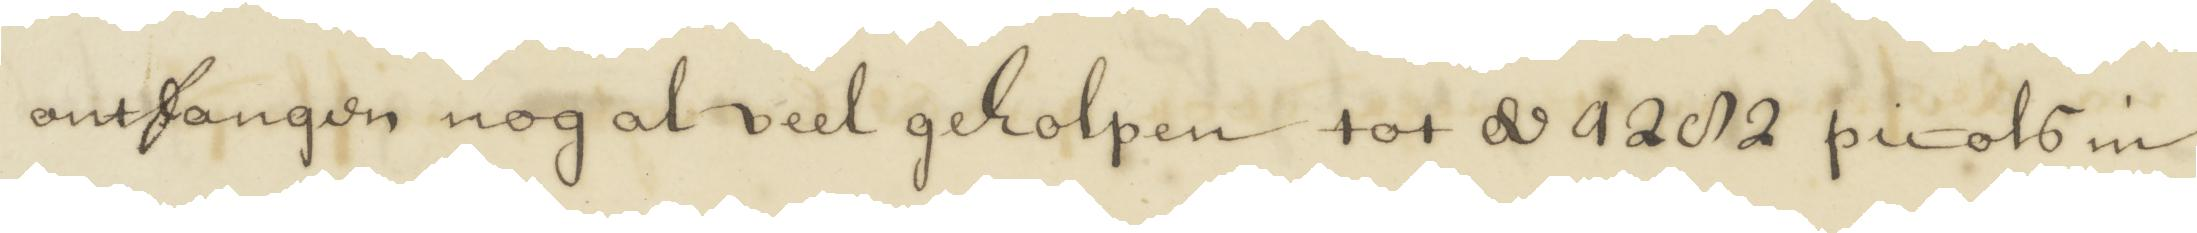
ontfangen nog al veel geholpen tot de 4282 picols in
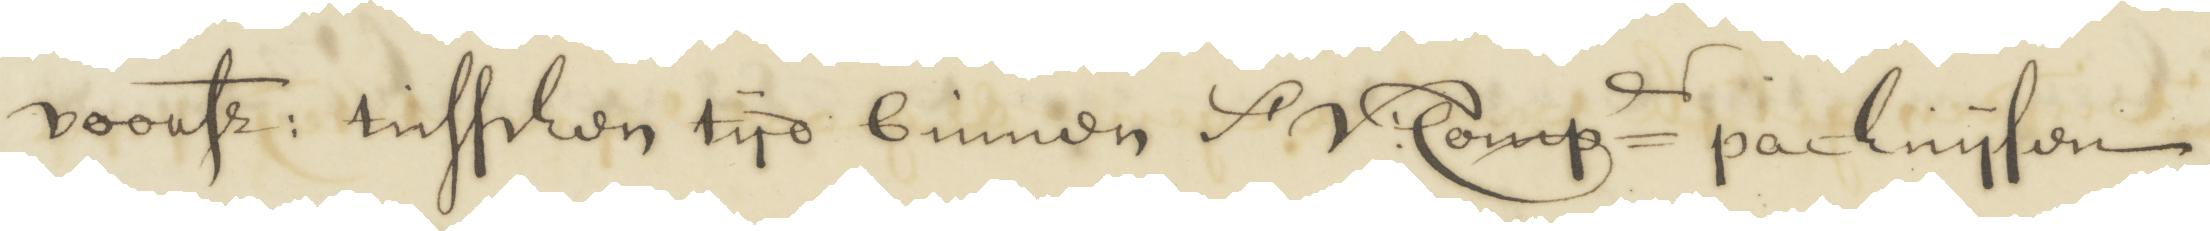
voorsz: tusschen tijd binnen S E: Comp=es pachuijsen
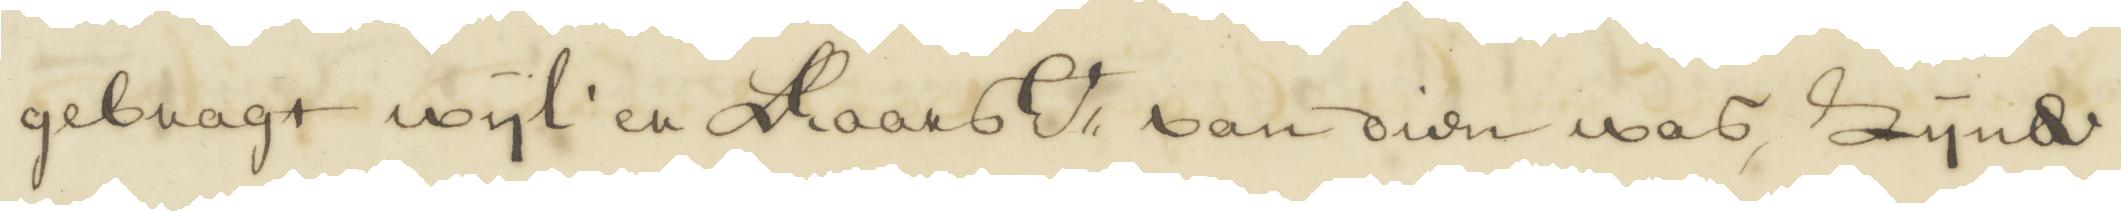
gebragt wijl 'er schaarsh„t van dien was, zijnde
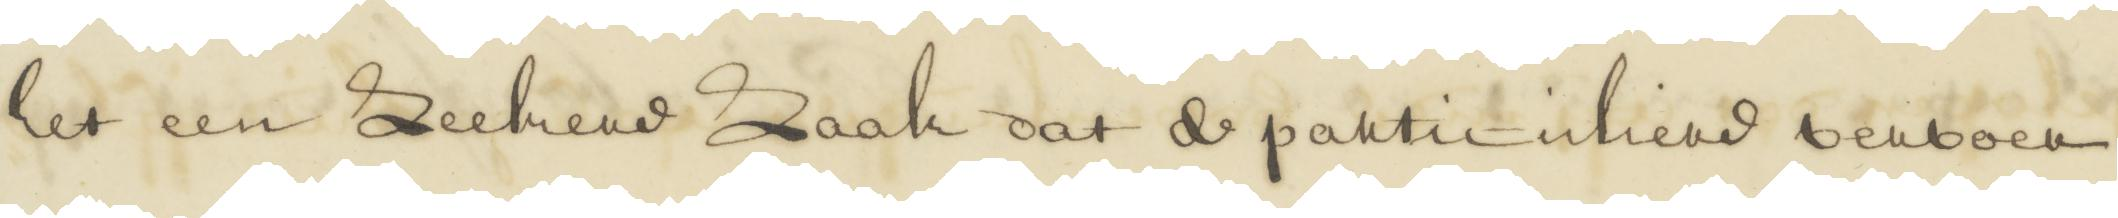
het een zeekere zaak dat de particuliere vervoer
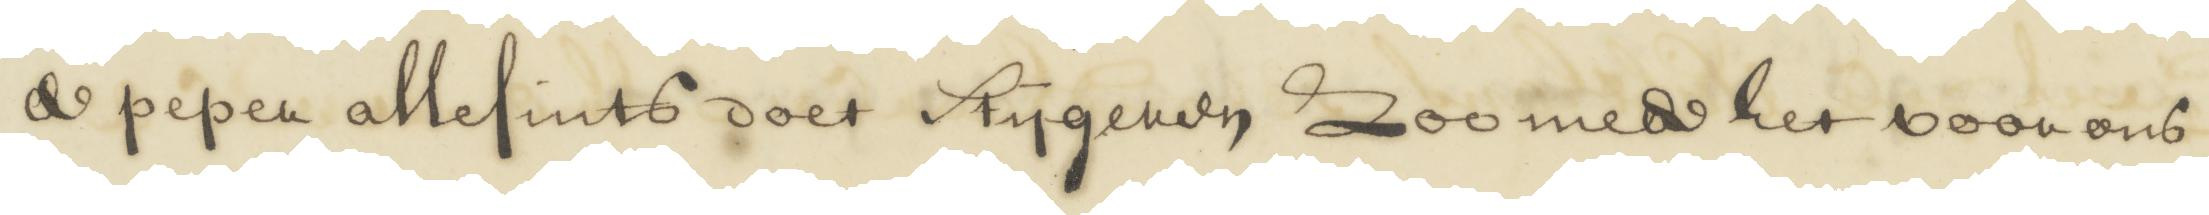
de peper allesints doet stijgeren zoo mede het voor ons
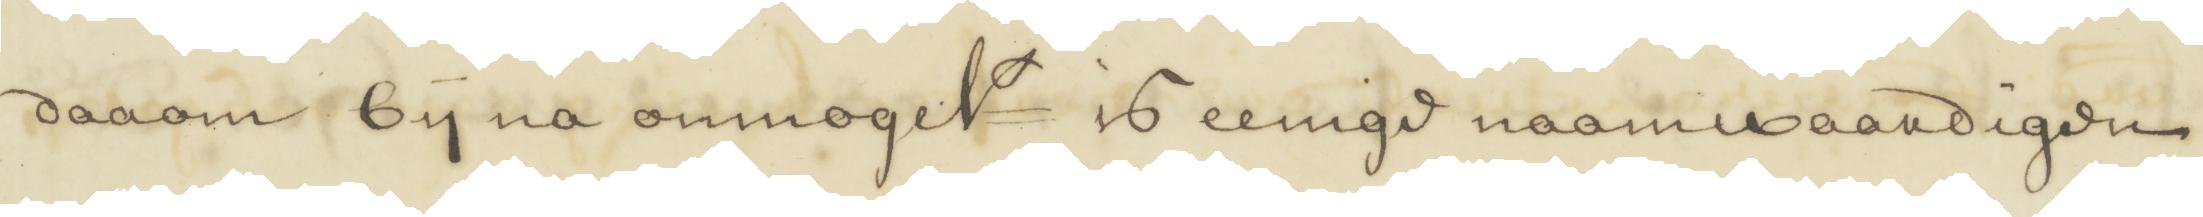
daaom bij na onmogel=t is eenige naamwaardigen
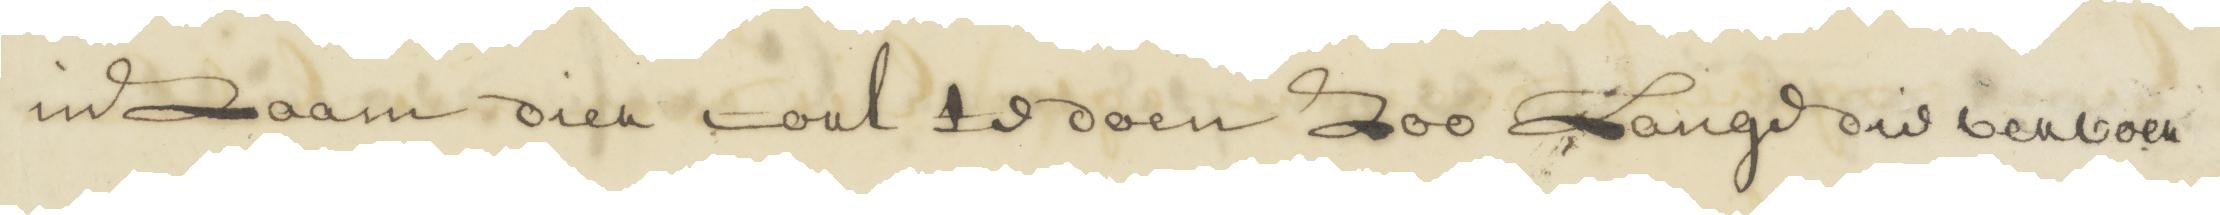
inzaam dier corl te doen zoo Lange die vervoer
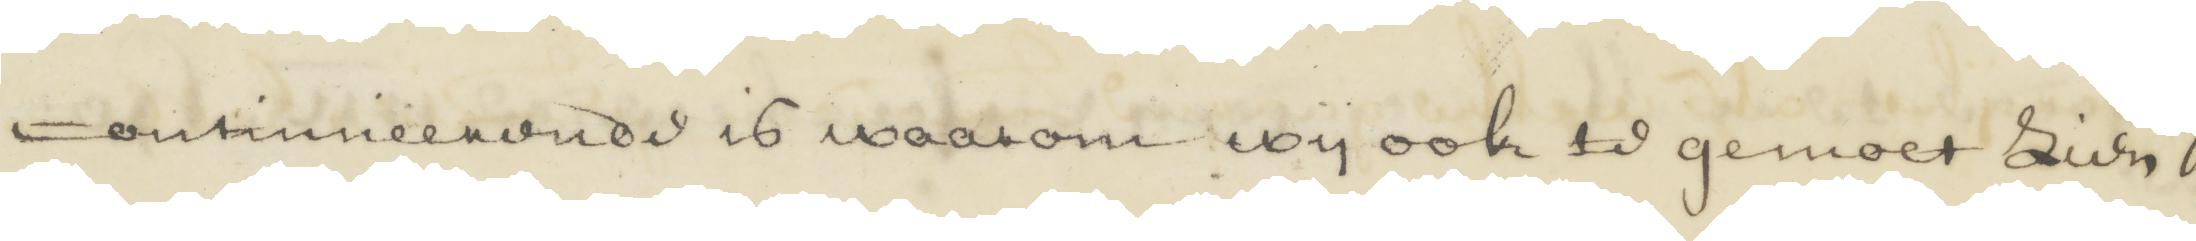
continueerende is waarom wij ook te gemoet zien
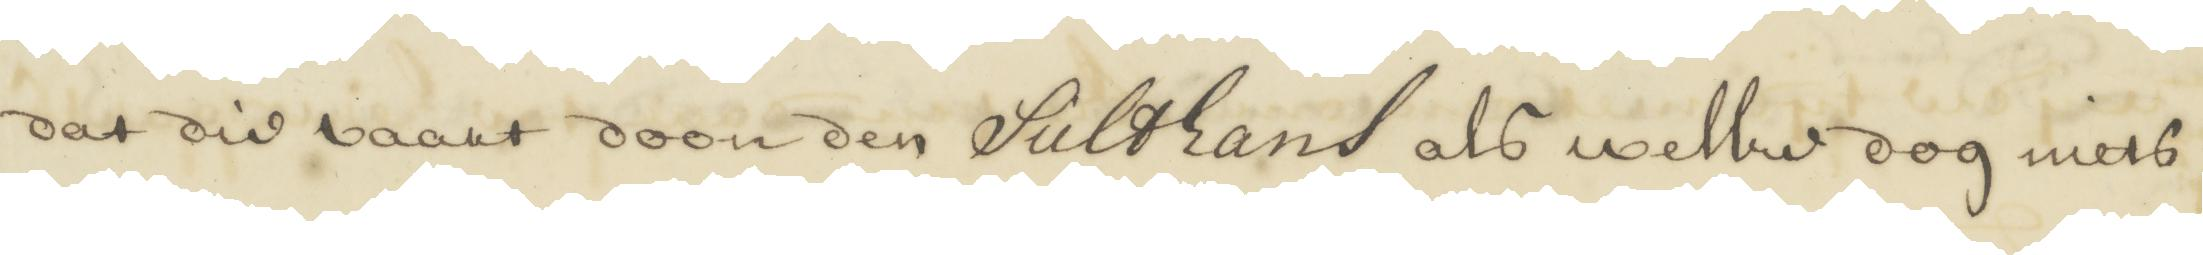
dat die vaart doon den Sulthans als welke dog niets
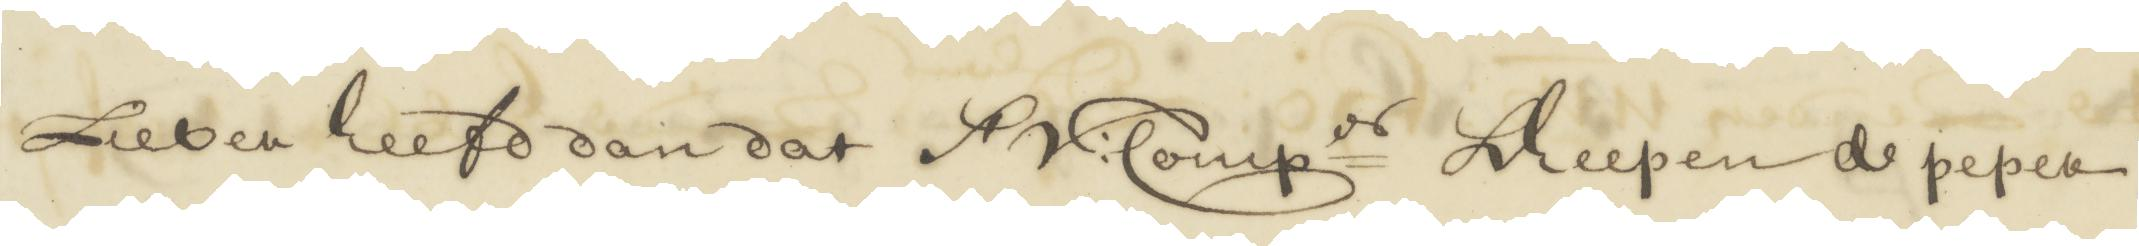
Liever heefd dan dat s E: Comp=es scheepen de peper
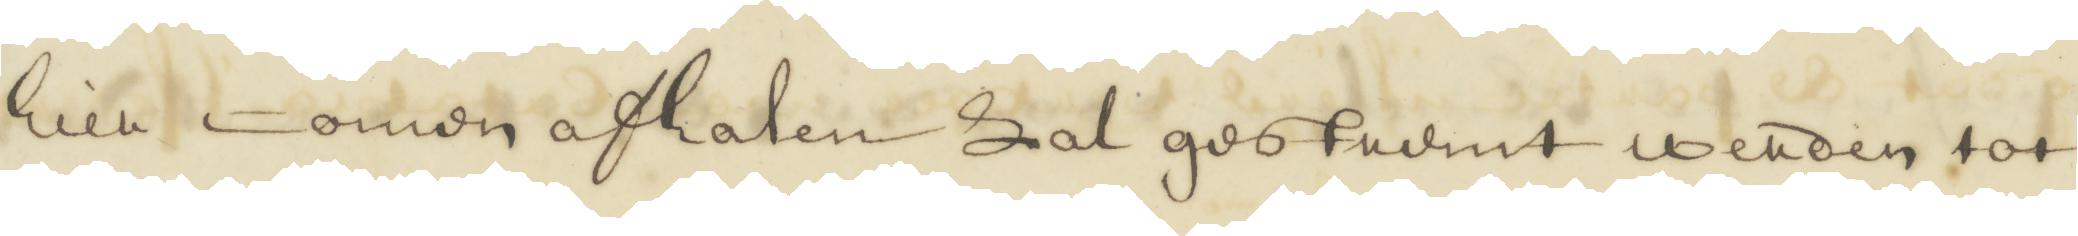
hier comen afhalen zal gestremt werden tot
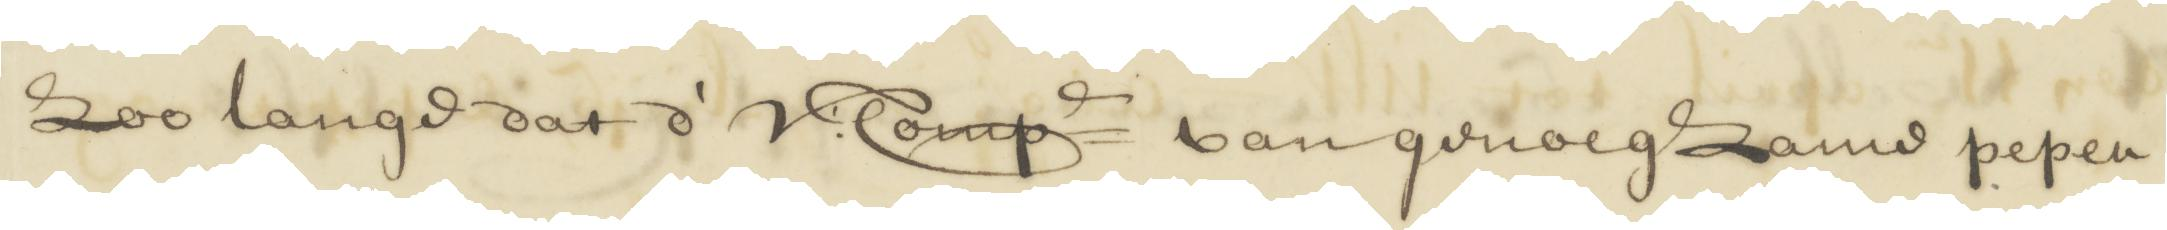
zoo lange dat d’ E: Comp=e van genoegzame peper
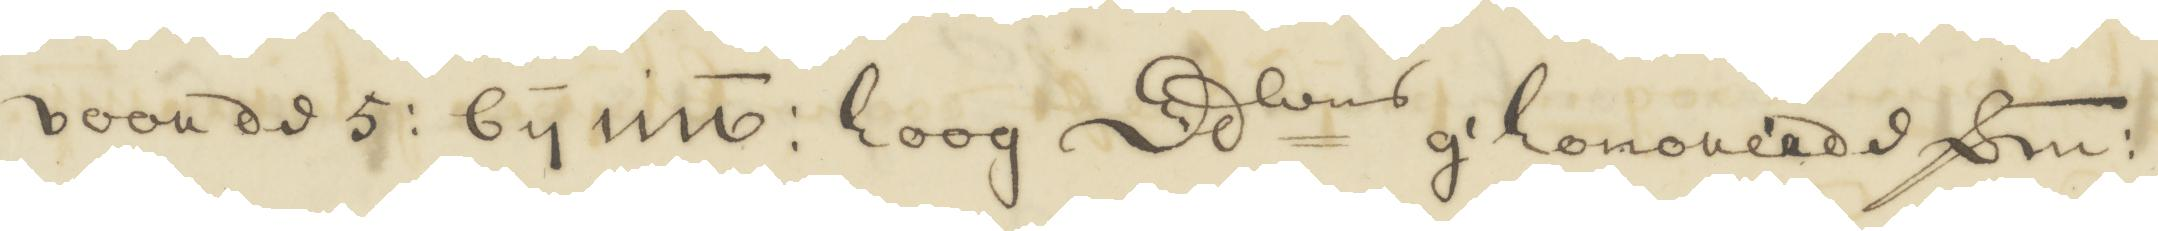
voor de 5: bij uw: hoog Ed=lens g’honoreede verm:
